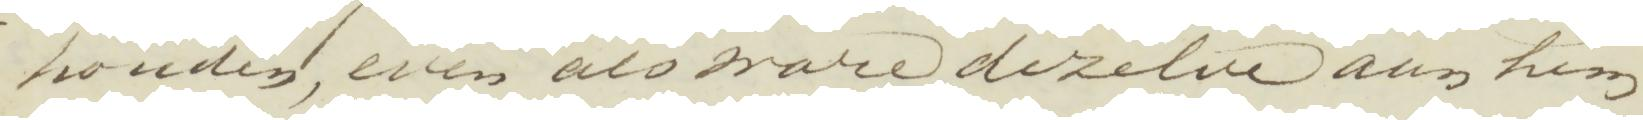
houden, even als ware dezelve aan hem
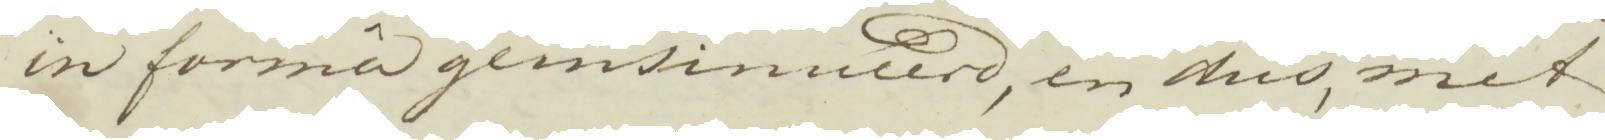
in formâ geinsinueerd, en dus, met
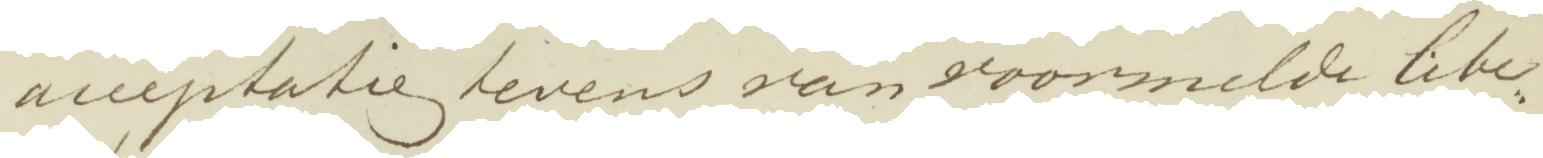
acceptatie tevens van voormelde libe„
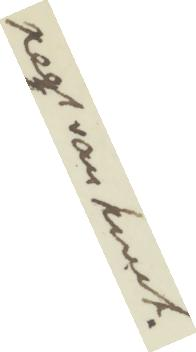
regt van kwit.
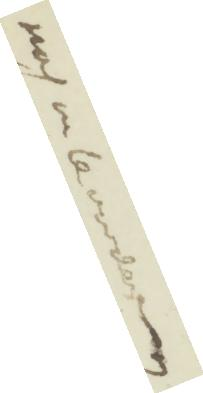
nog in te vorderen
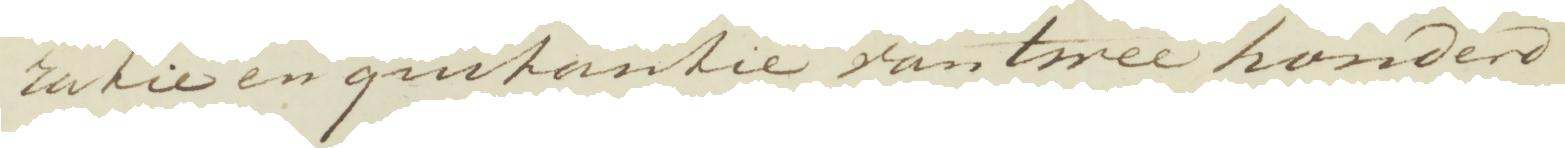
ratie en quitantie van twee honderd
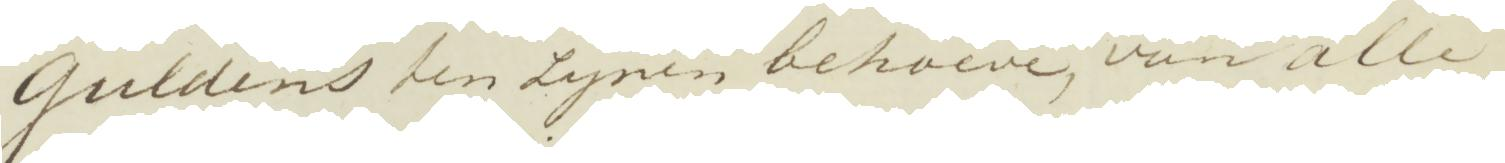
Guldens ten zynen behoeve, van alle
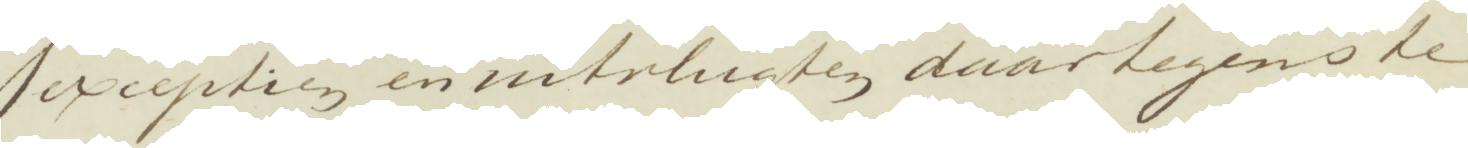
exceptien en uitvlugten daartegens te
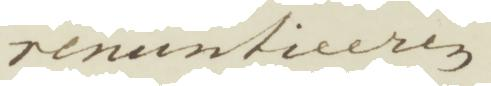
renuntieeren
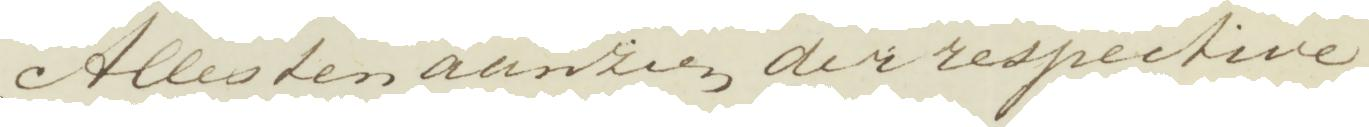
Alles ten aanzien der respective
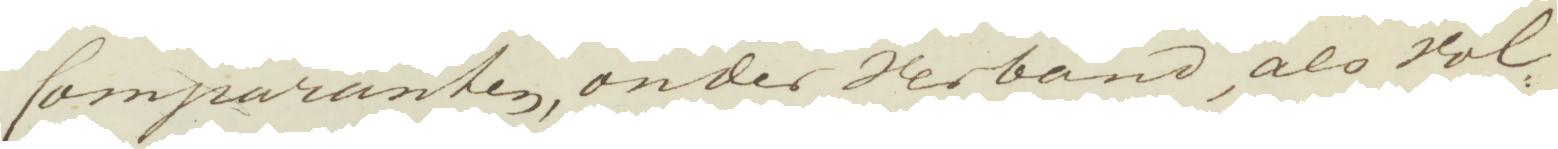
Comparanten, onder verband, als vol=
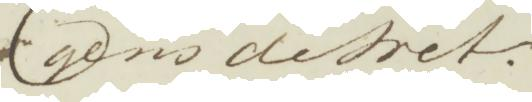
gens de wet.
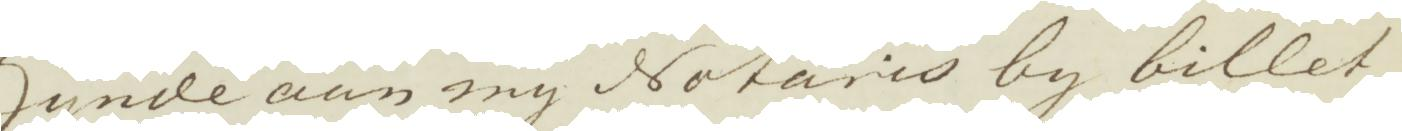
Zynde aan my Notaris by billet,
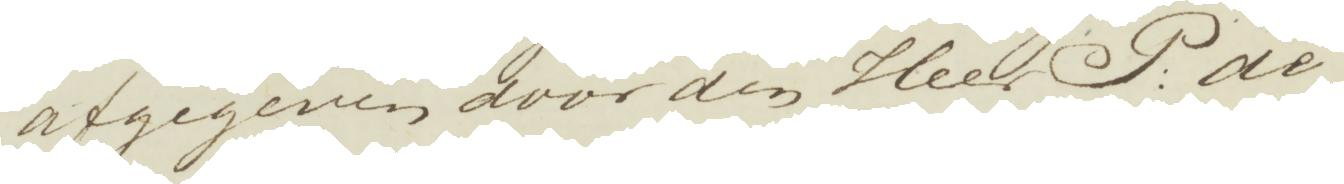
afgegeven door den Heer P: de
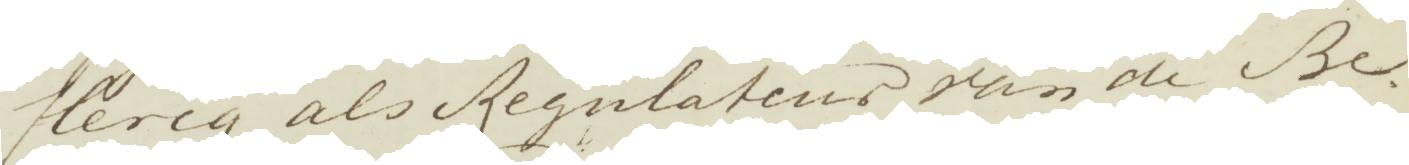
Clerq, als Regulateur van de Be=
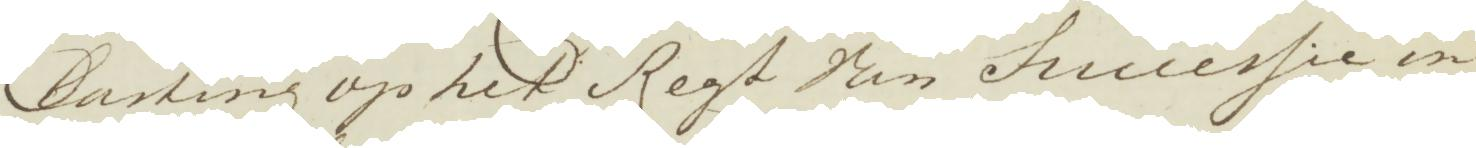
=lasting op het Regt van Successie in
